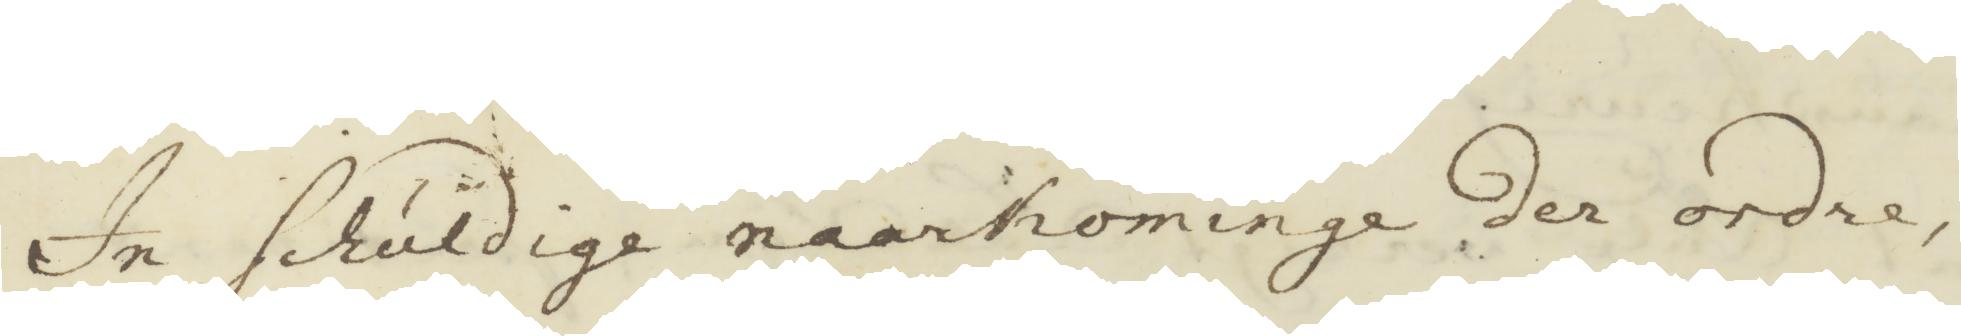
In schuldige naarkominge der ordre,
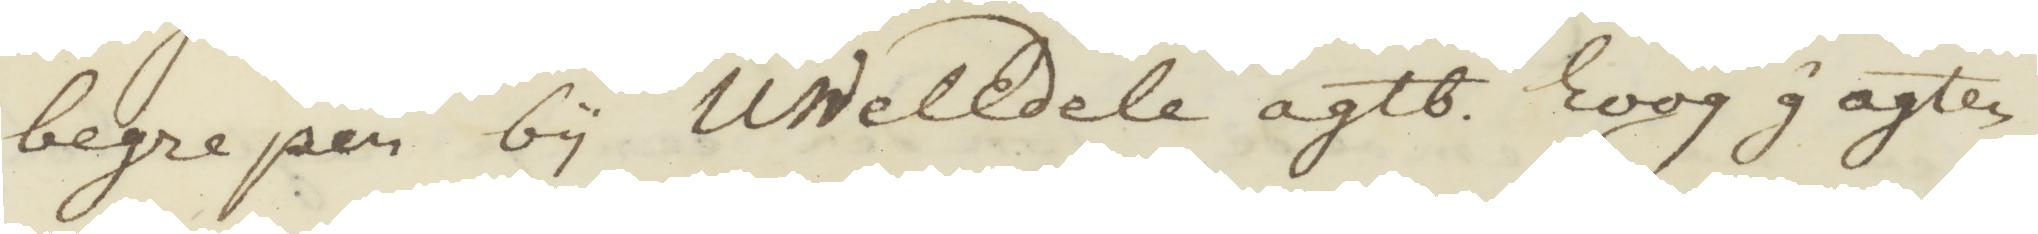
begrepen bij UwelEdele agtb: hoog g’agten
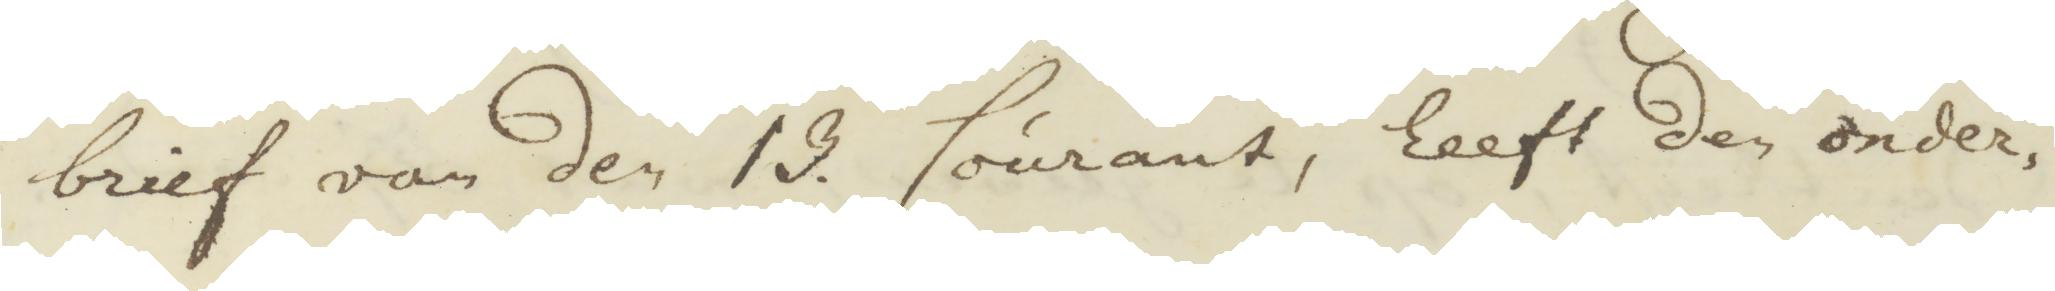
brief van den 13. Courant, heeft den onder,
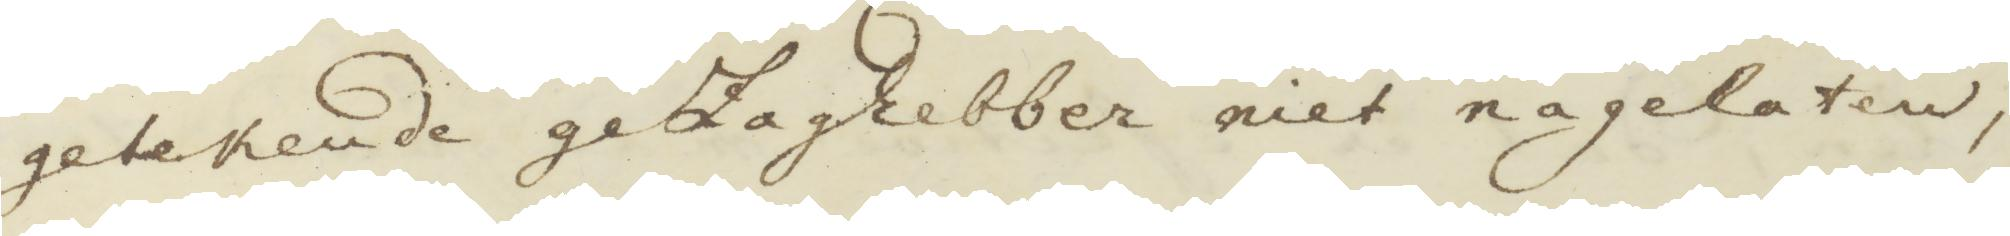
getekende gezaghebber niet nagelaten,
